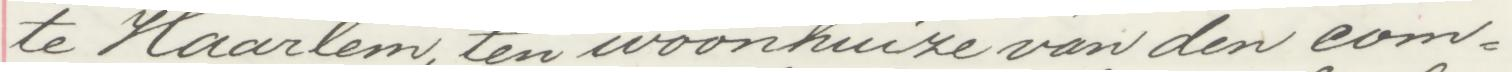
te Haarlem, ten woonhuize van den com=
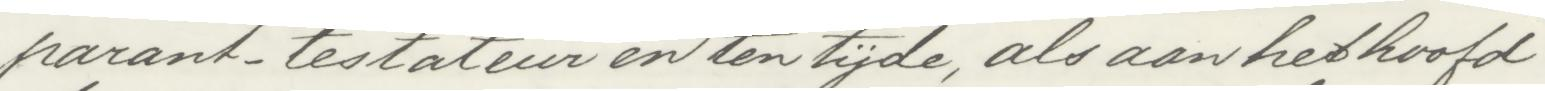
parant-testateur en ten tijde, als aan het hoofd
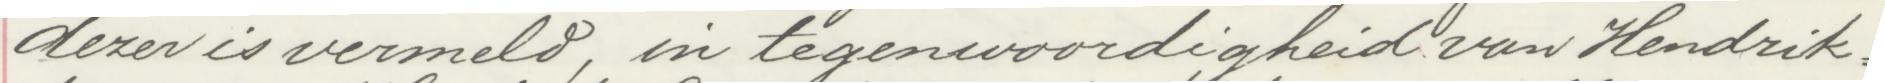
dezer is vermeld, in tegenwoordigheid van Hendrik=
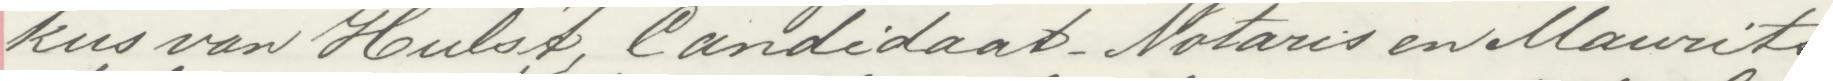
kus van Hulst, Candidaat-Notaris en Maurits
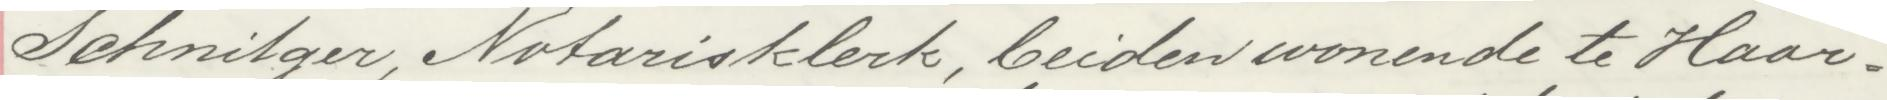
Schnitger, Notarisklerk, beiden wonende te Haar„
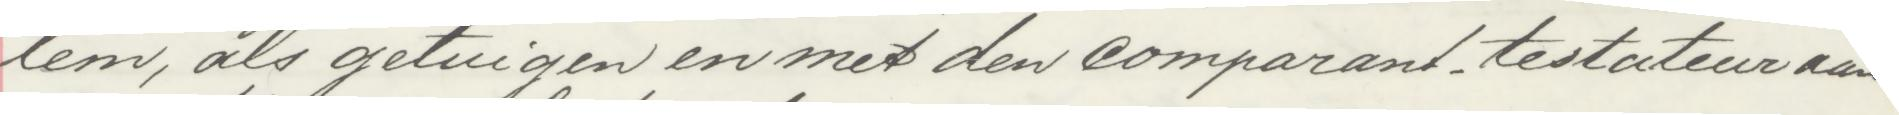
lem, als getuigen en met den comparant-testateur aan
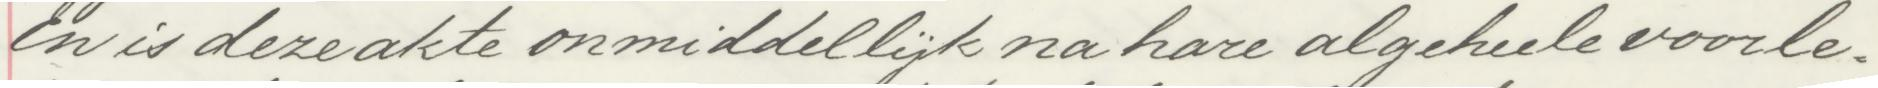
En is deze akte onmiddellijk na hare algeheele voorle„
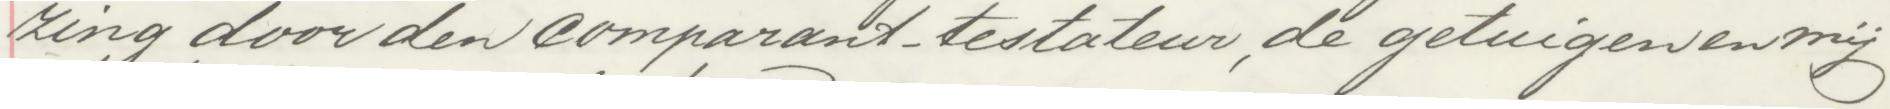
zing door den comparant-testateur, de getuigen en mij
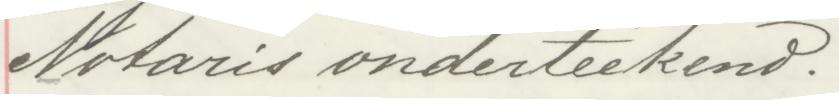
Notaris onderteekend.
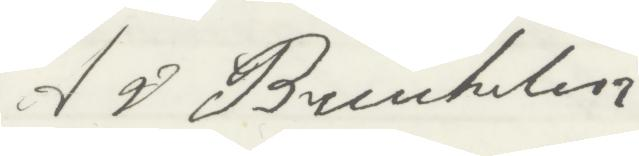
A v Breukelen
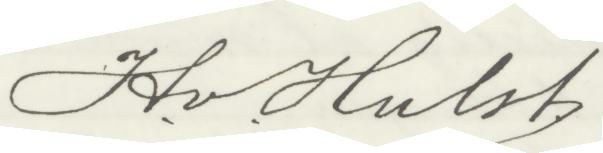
HvHulst
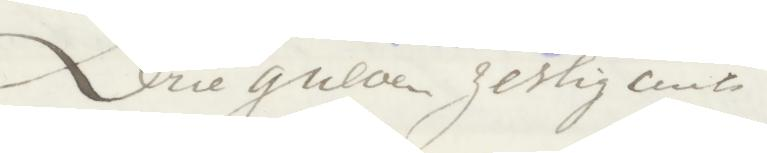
Drie gulden Zestig cents
